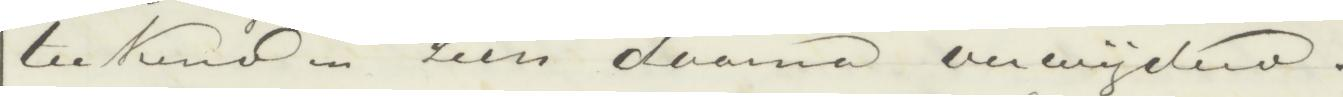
teekend en zich daarna verwijderd
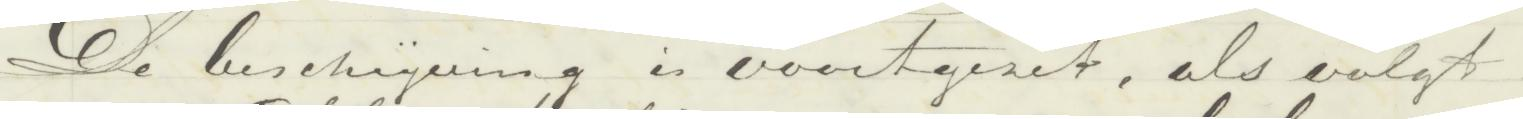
De beschijving is voortgezet, als volgt
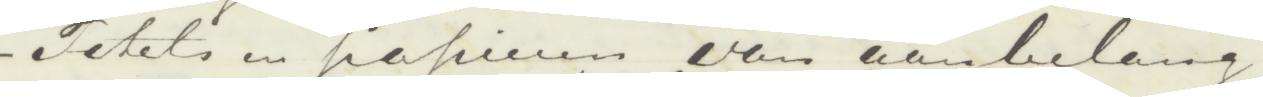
Titels en papieren van aanbelang
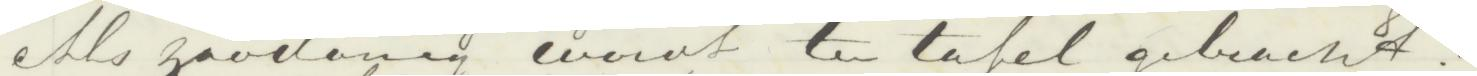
Als zoodanig wordt ter tafel gebracht:
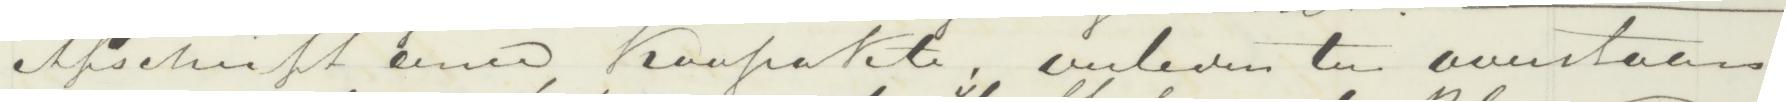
Afschrift eener koopakte, verleden ten overstaan
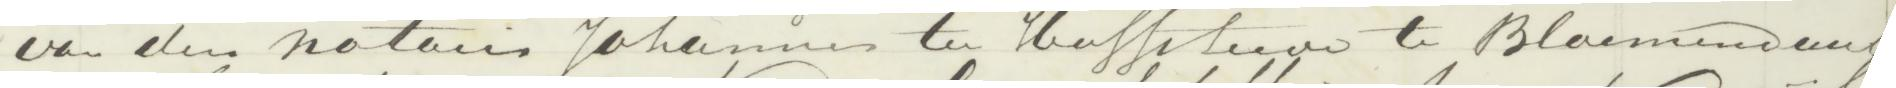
van den notaris Johannes ten Hoffsteede te Bloemendaal
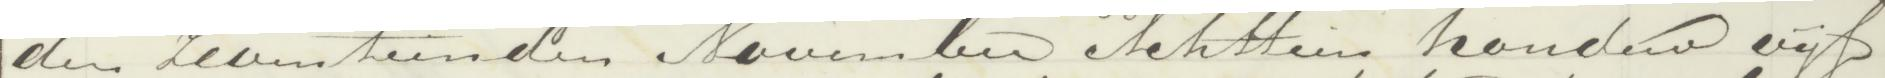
den zeventienden November Achttien honderd vijf
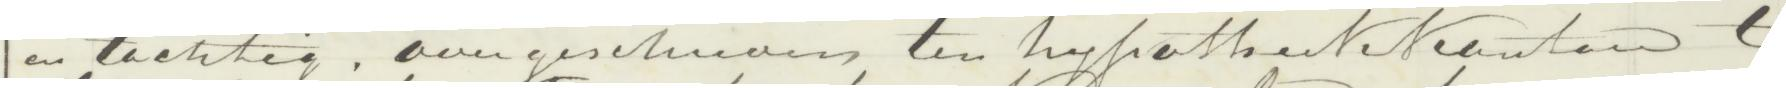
en tachtig, overgeschreven ten hypotheekkantore te
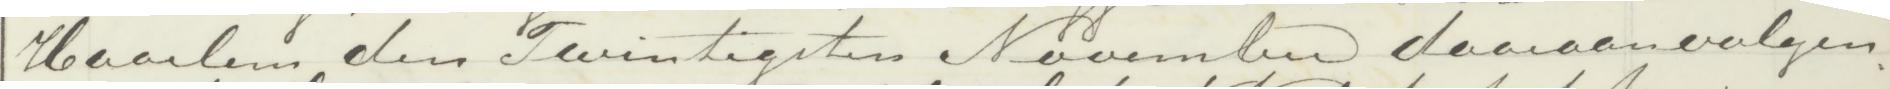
Haarlem den Twintigsten November daaraanvolgen
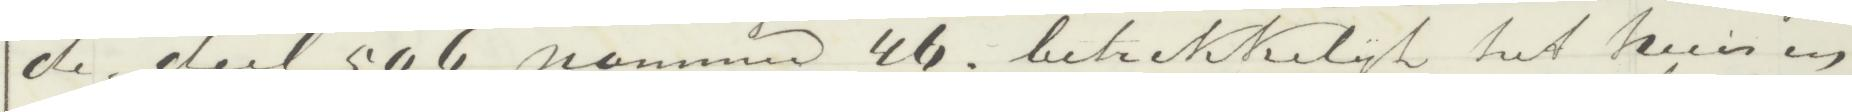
de, deel 506, nommer 46. betrekkelijk het huis en
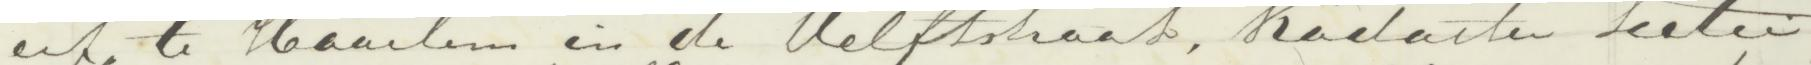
erf te Haarlem in de Delftstraat, kadaster sectie
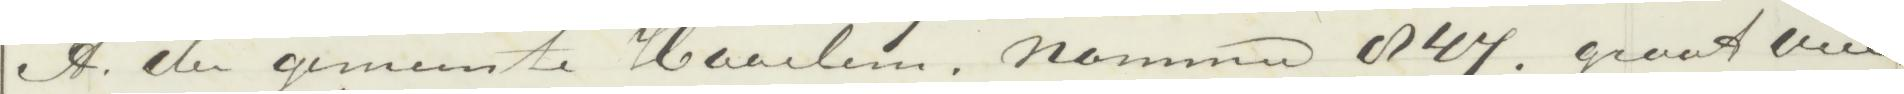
A. der gemeente Haarlem, nommer 847, groot vier
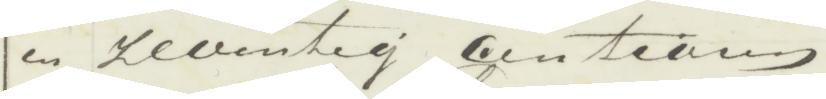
en zeventig centiaren
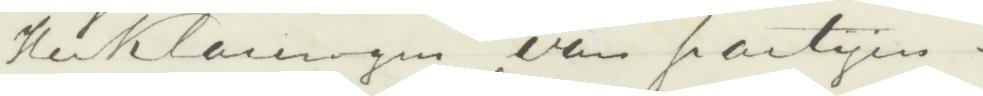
Verklaringen van partijen.
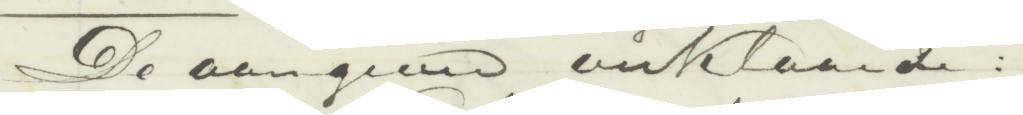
De aangever verklaarde:
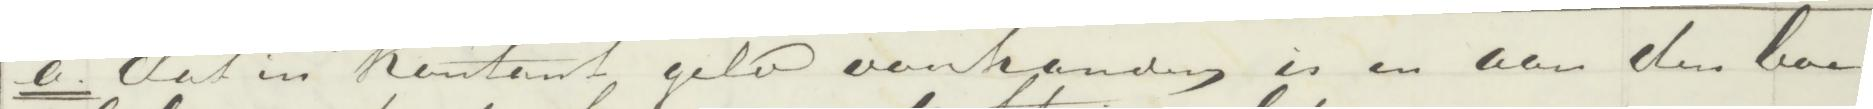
a. dat in kontant geld voorhanden is en aan den boe
